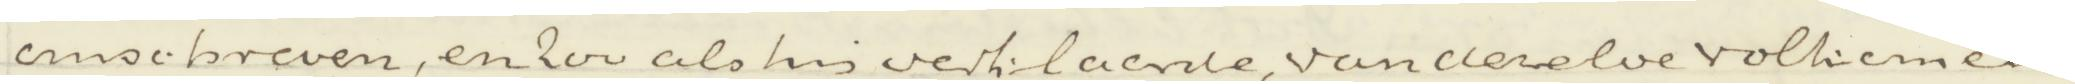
omschreven, en zoo als hij verklaarde, van dezelve volkomen
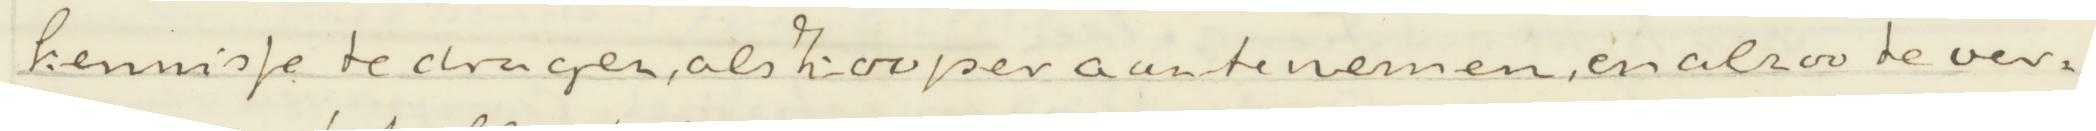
kennisse te dragen, als kooper aantenemen, en alzoo te ver=
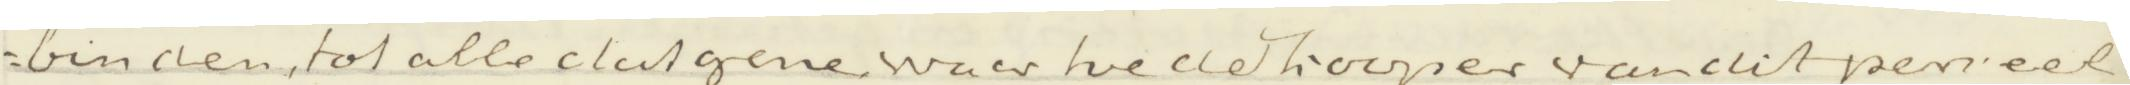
=binden, tot alle dat gene, waar toe de kooper van dit perceel
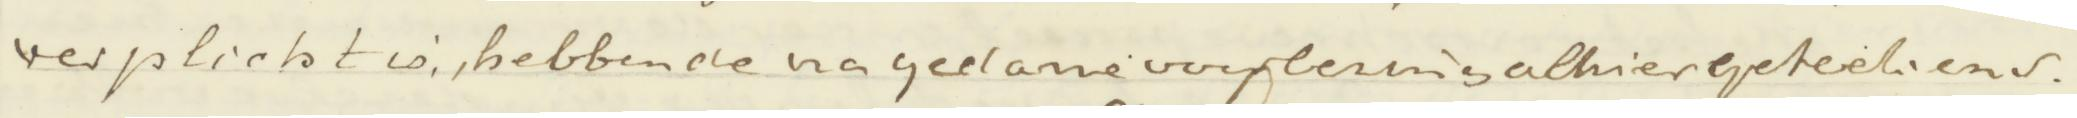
verplicht is, hebbende na gedane voorlezing alhier geteekend.
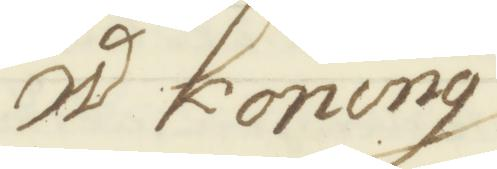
W Koning
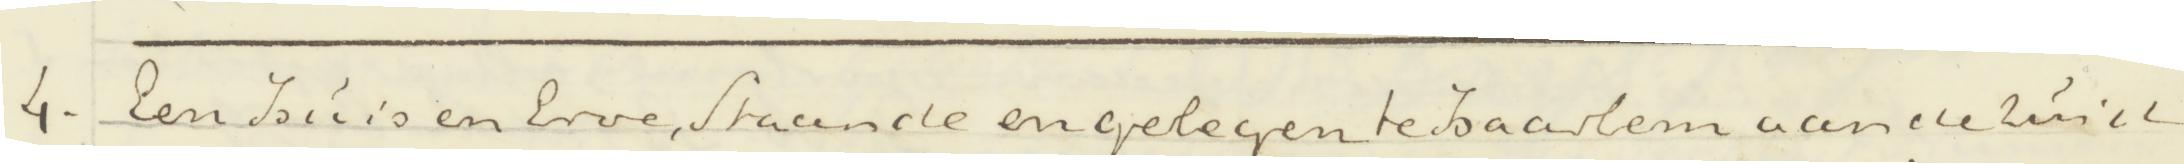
4 - Een huis en Erve, staande en gelegen te haarlem aan de zuid
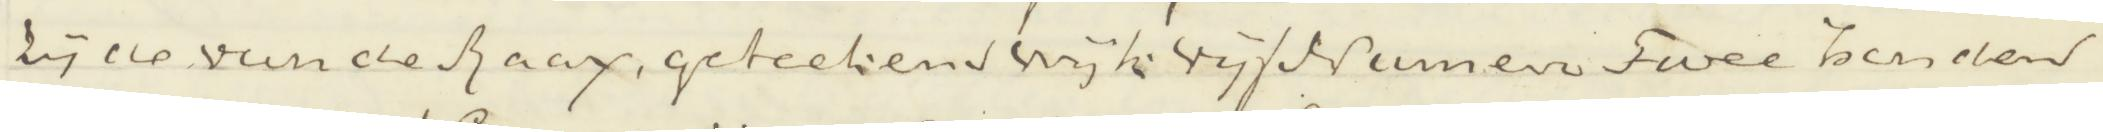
zij de van de Raax, geteekend wijk vijf Numero Twee honderd
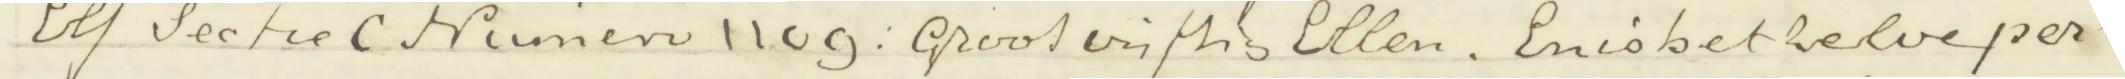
Elf Sectie C Numero 1109: Groot vijftig Ellen. En is het zelve per=
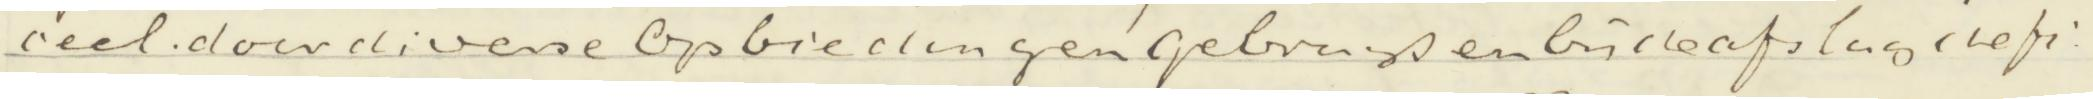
ceel door diverse opbiedingen gebragt en bij de afslag defi
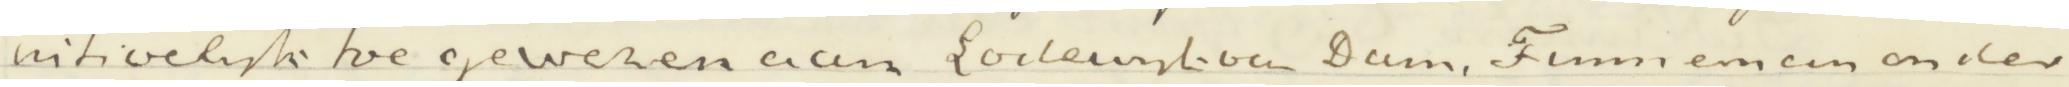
nitivelijk toe gewezen aan Lodewyk van Dam, Timmerman onder
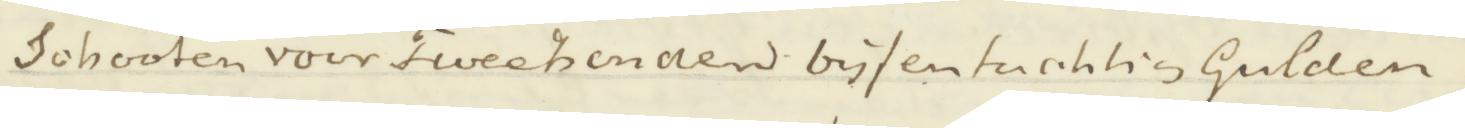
Schooten voor Tweehonderd vijf en tachtig Gulden
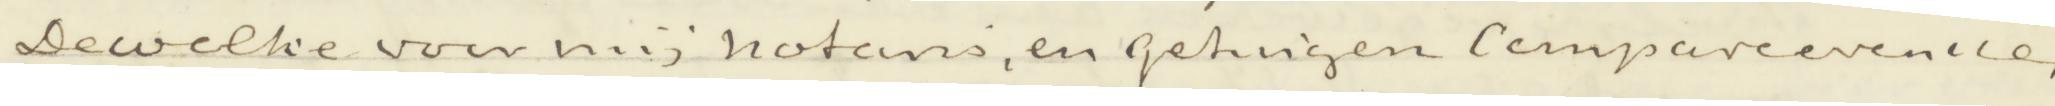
Dewelke voor mij notaris, en getuigen compareerende
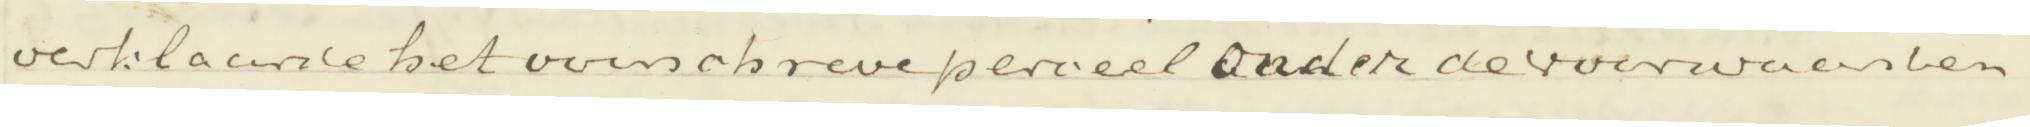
verklaarde het voorschreve perceel onder de voorwaarden
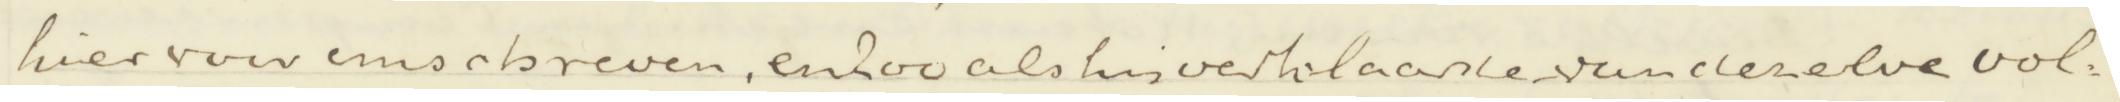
hier voor omschreven, en zoo als hij verklaarde van dezelve vol=
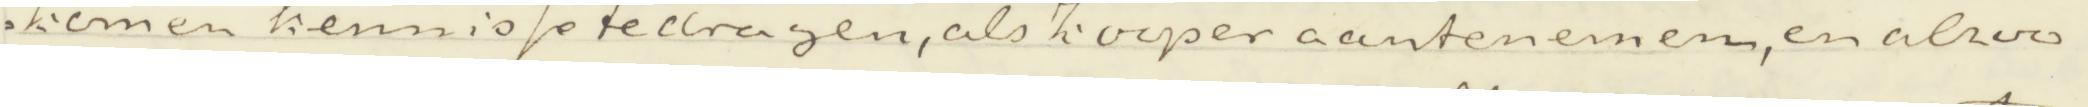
komen kennisse te dragen, als kooper aantenemen, en alzoo
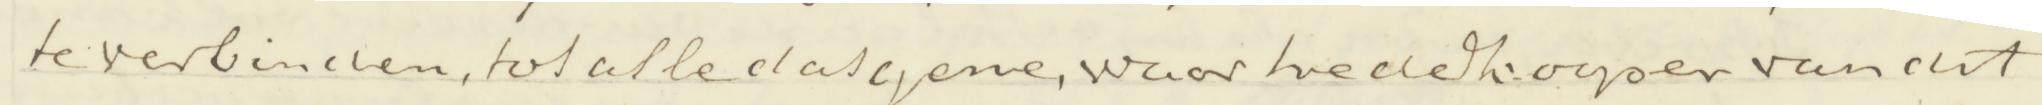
te verbinden, tot alle datgene, waar toe de kooper van dit
